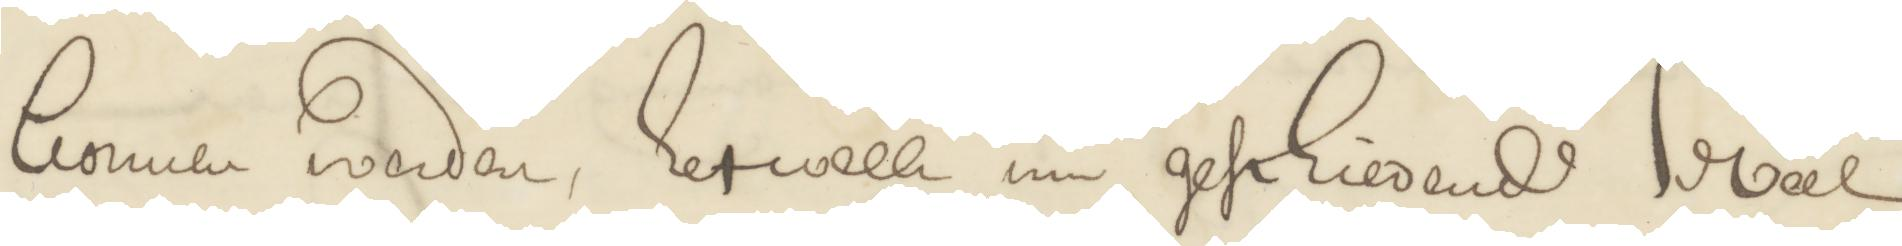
konnen werden, het welk uw geschiedende te veel
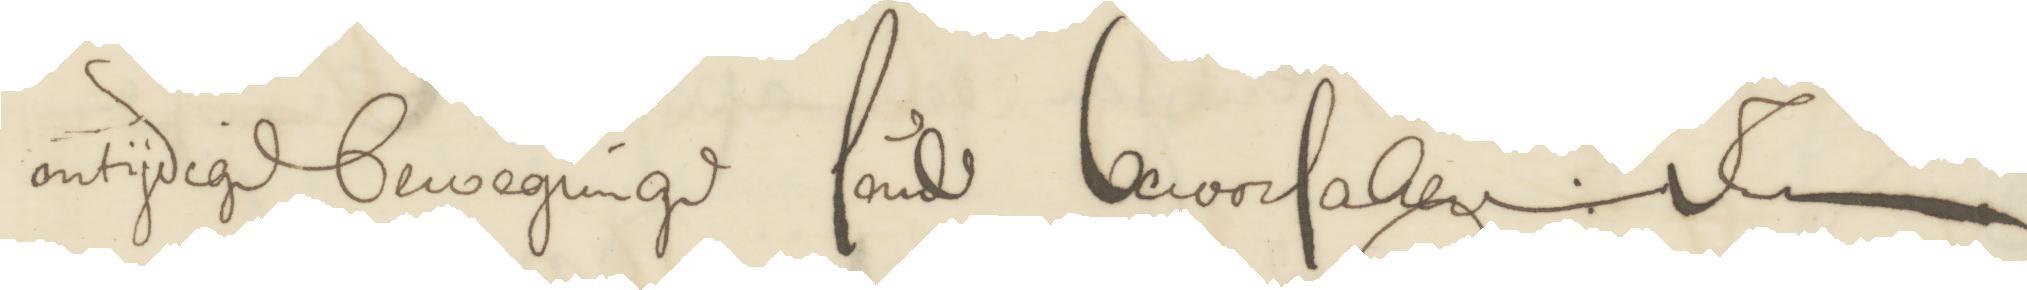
ontijdige beweginge soude veroorsaken: En
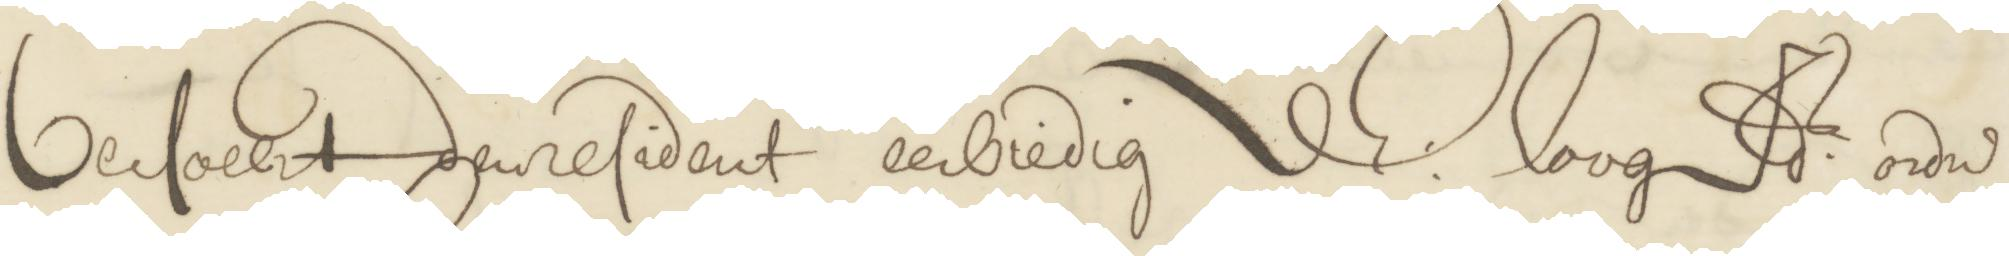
versoekt den resident eerbiedig VE: hoog Ed:s ordre
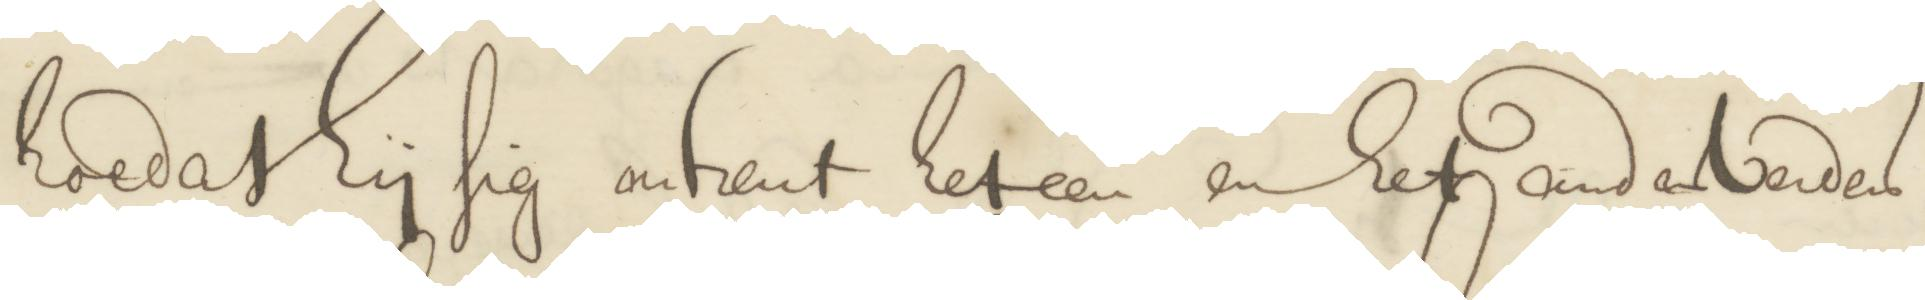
hoe dat hij sig ontrent het een en het ander verder
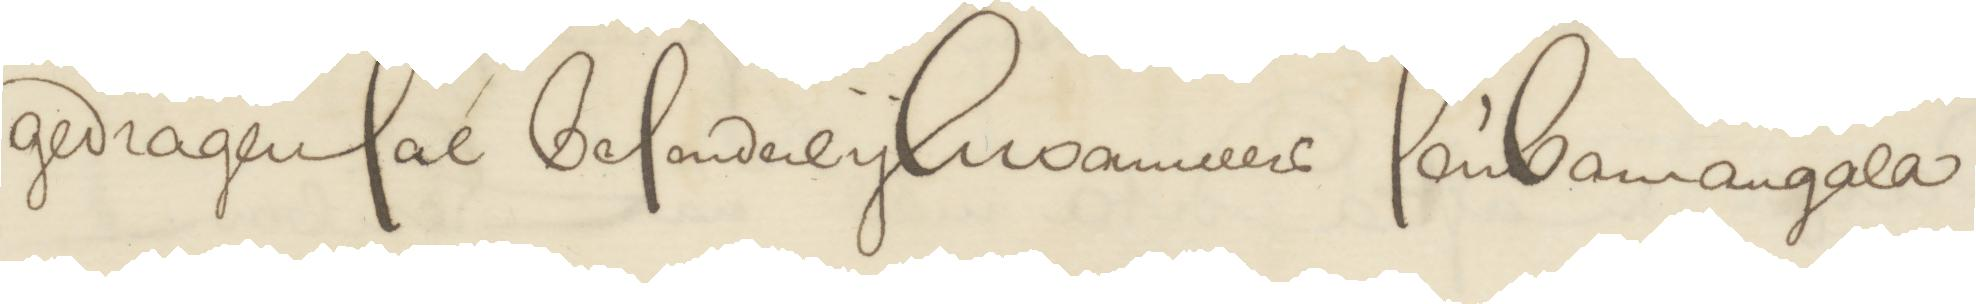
gedragen sal besonderlijk wanneers soubamangala
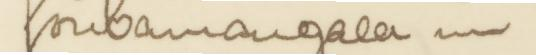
soubamangala in
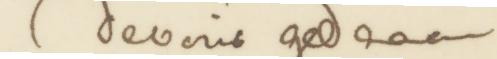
devoirs gedaan
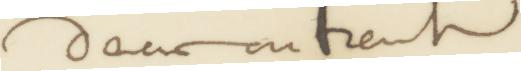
daar ontrent
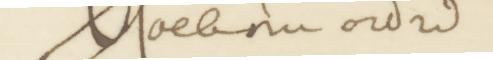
versoek om ordre
